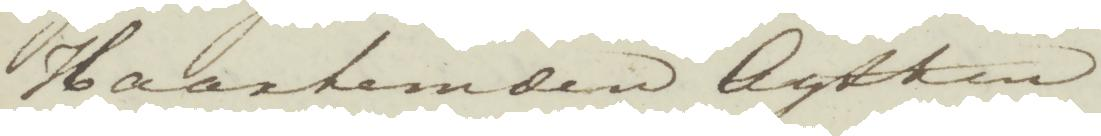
Haarlem den Agtten
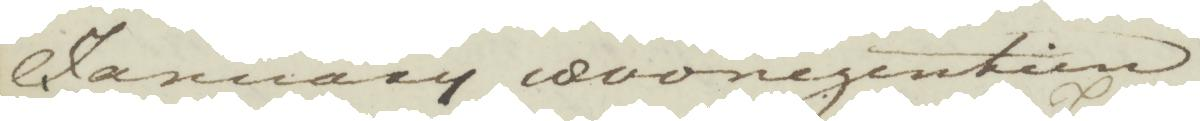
January 1800negentien
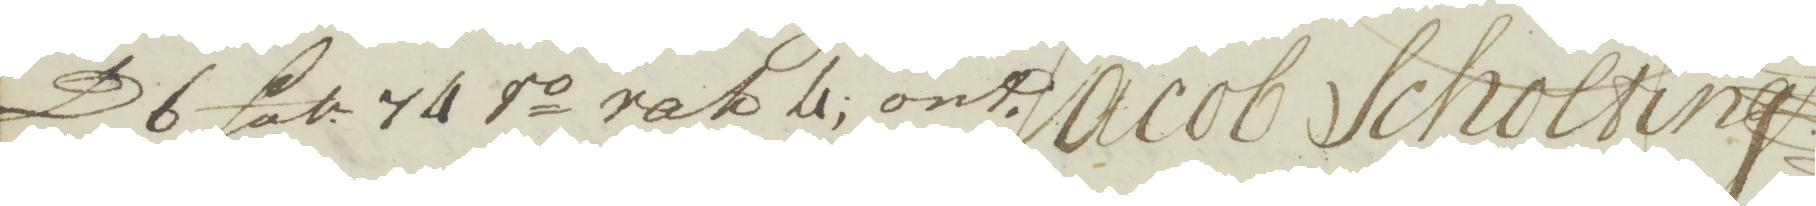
D6 fol: 74 V=o vak 4: ont„ Jacob Scholting
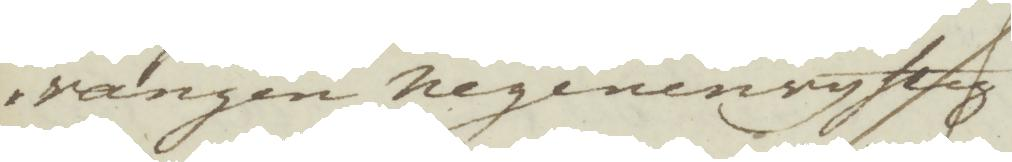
„vangen negenenvyftig
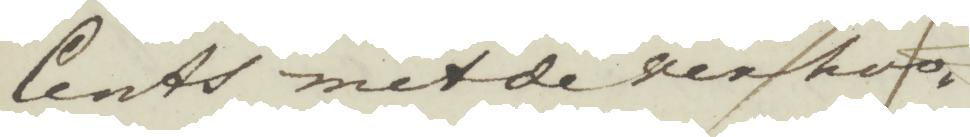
Cents met de verhoo„
